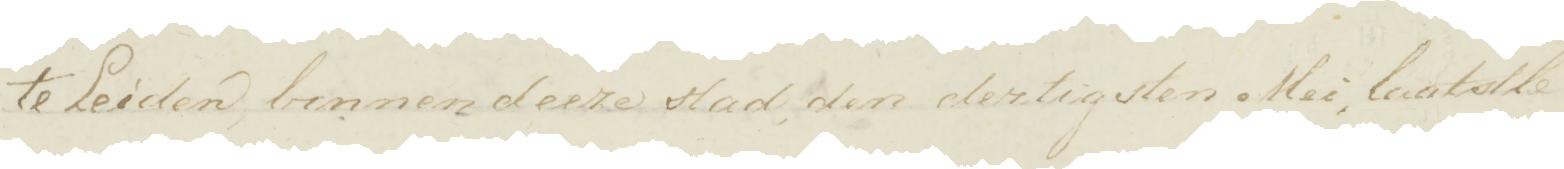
te Leiden, binnen deeze stad, den dertigsten Mei, laatstle
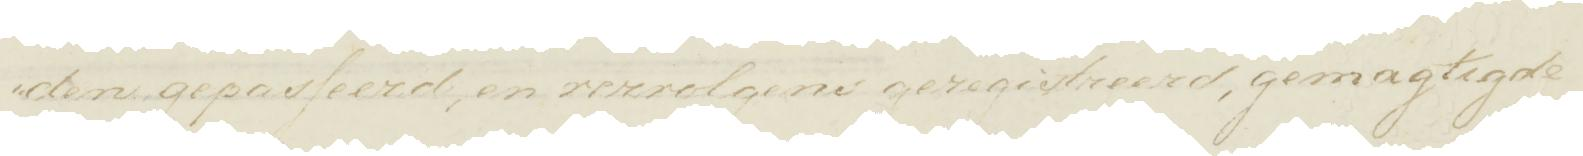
„den gepasseerd, en vervolgens geregistreerd, gemagtigde
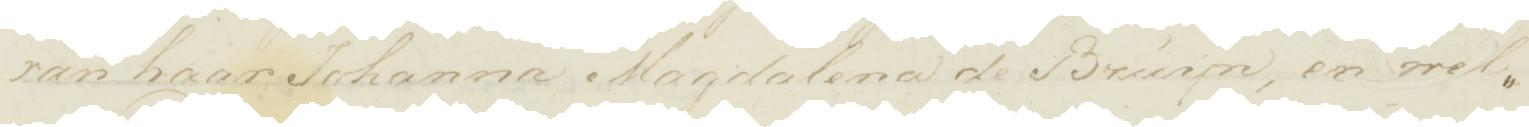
van haar Johanna Magdalena de Bruyn, en wel„
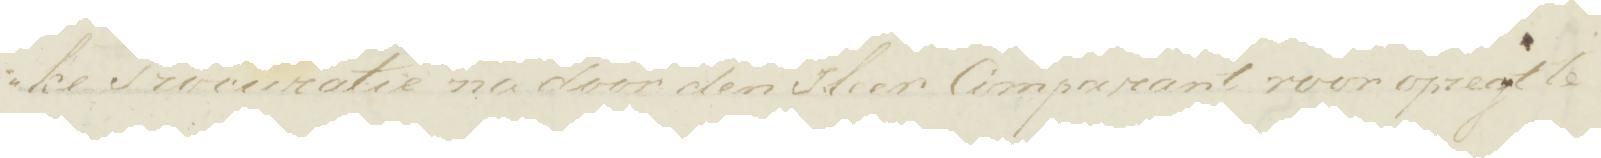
„ke Procuratie na door den Heer Comparant voor opregt te
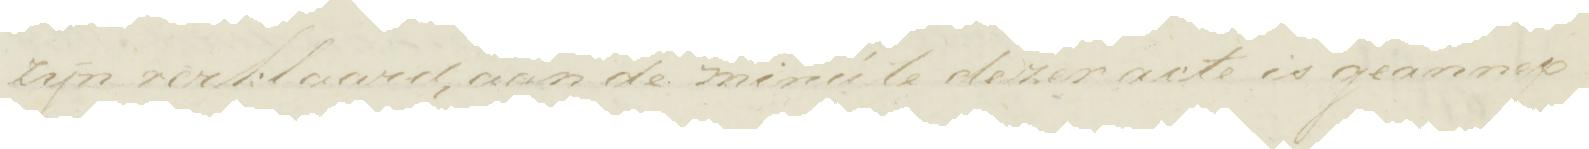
zijn verklaard, aan de minute dezer acte is geannex
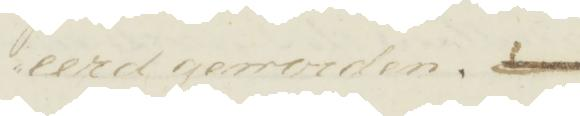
„eerd geworden.
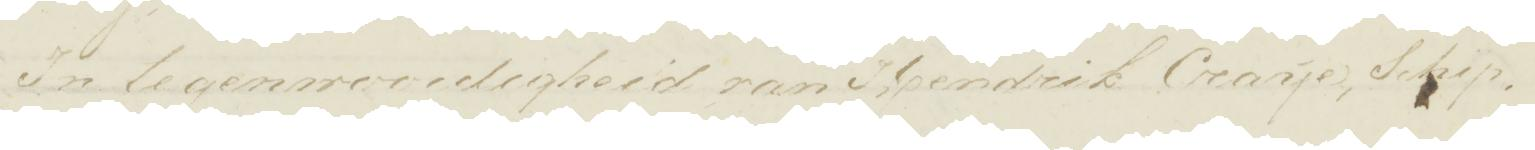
Jn tegenwoordigheid van Hendrik Craije, schip
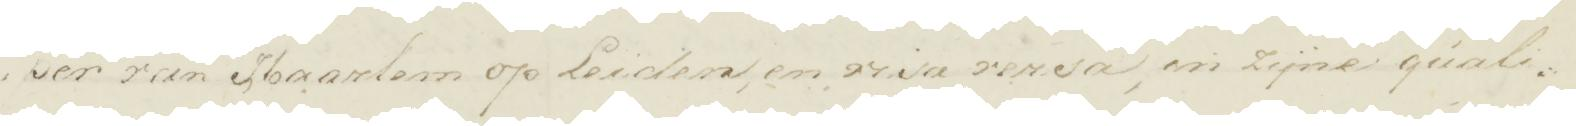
per van Haarlem op Leiden, en visa versa, in zijne quali„
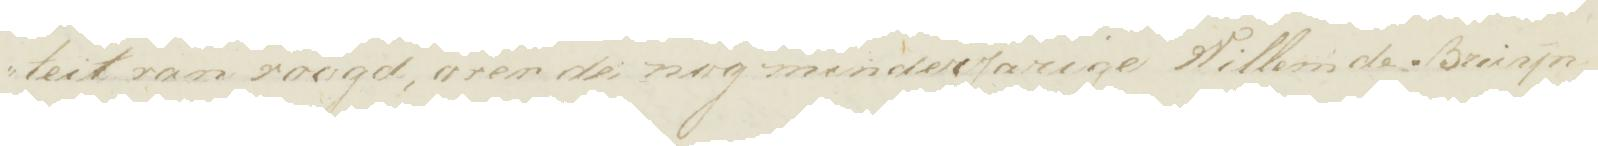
„teit van voogd, over de nog minder jarige Willem de Bruyn,
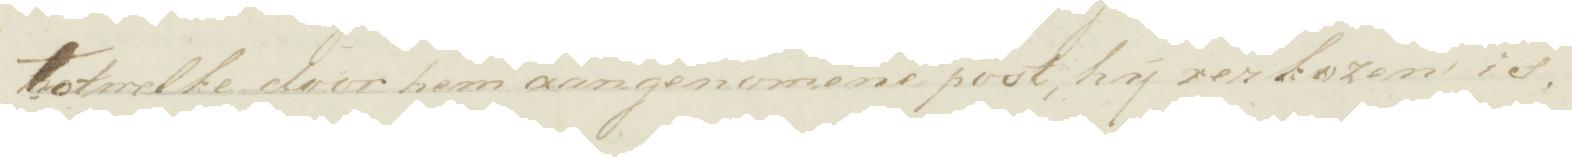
tot welke door hem aangenomene post, hij verkozen is,
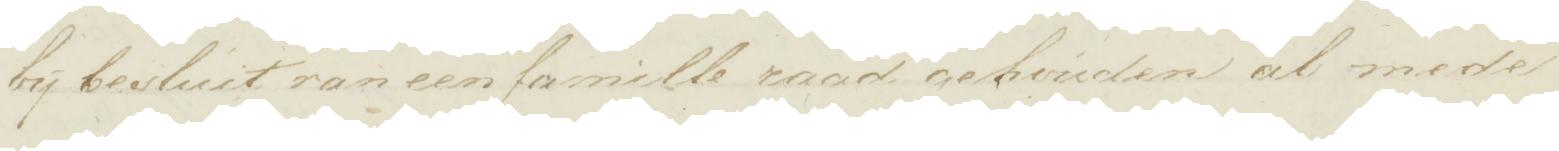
bij besluit van een famille raad gehouden al mede
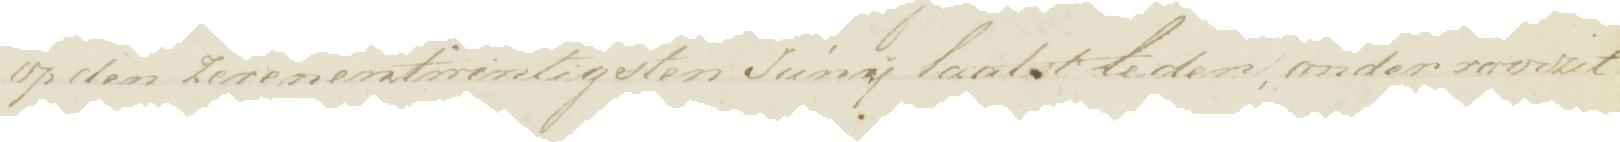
op den zevenentwintigsten Junij laatstleden, onder voorzit
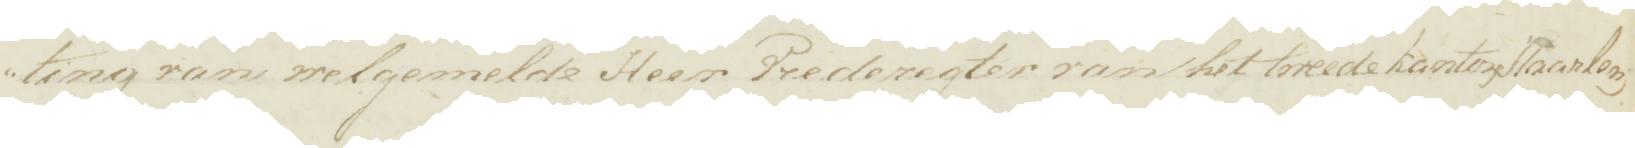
„ting van welgemelde Heer Vrederegter van het tweede kanton Haarlem
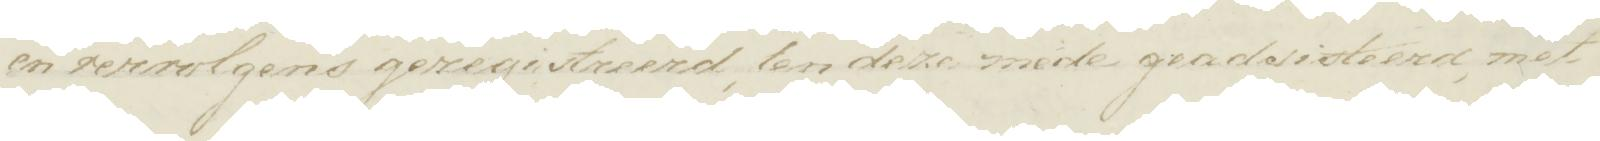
en vervolgens geregistreerd, ten deze mede geadsisteerd, met
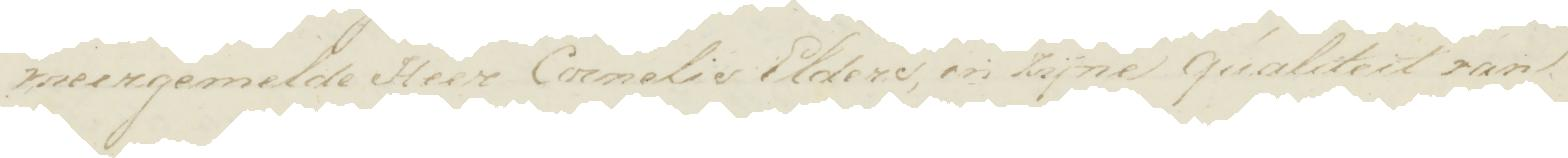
meergemelde Heer Cornelis Elders, in zijne qualiteit van
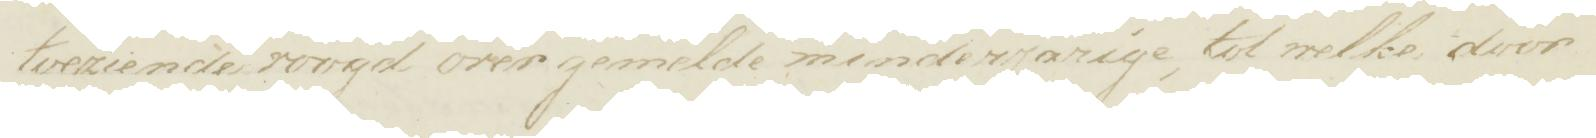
toeziende voogd over gemelde minderjarige, tot welke door
